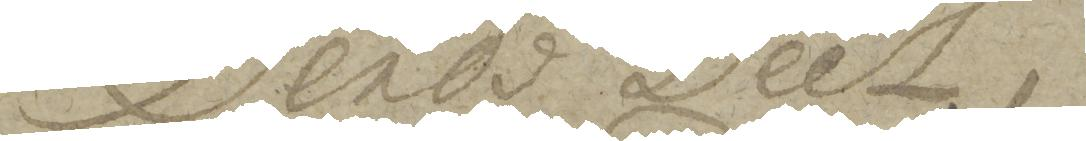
Derde Deel,
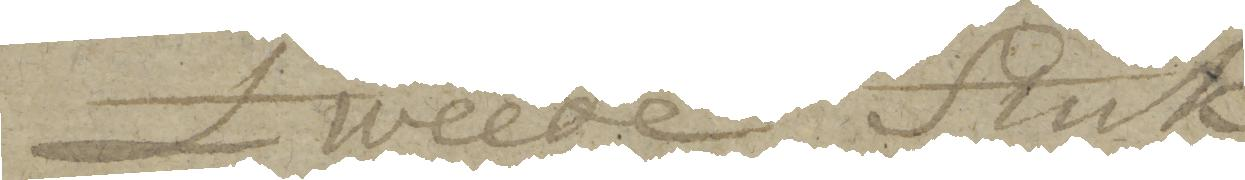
tweede stuk
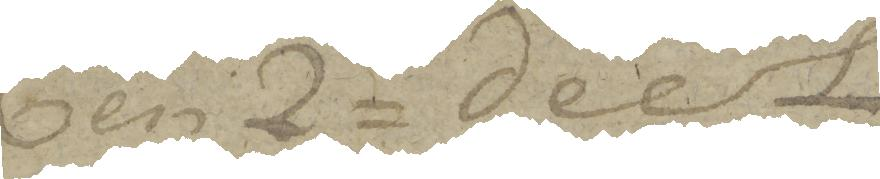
Een 2=e deel
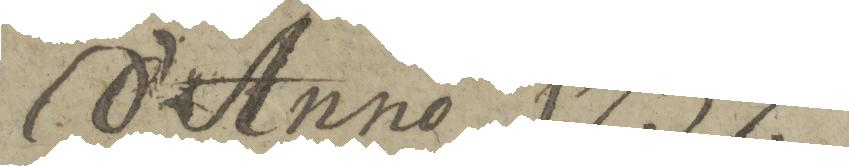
d'Anno 1737.
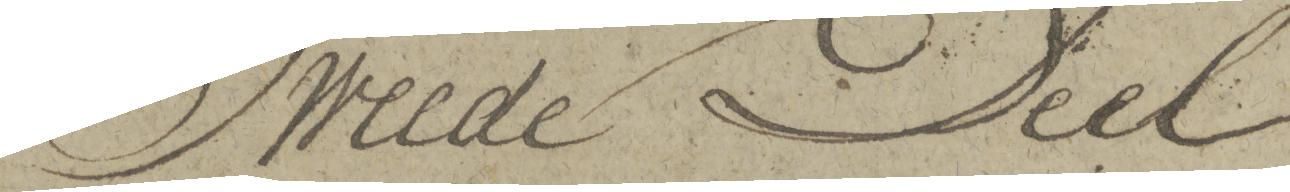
Tweede Deel
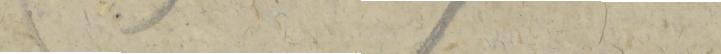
P
